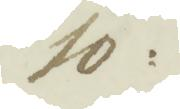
10 :
